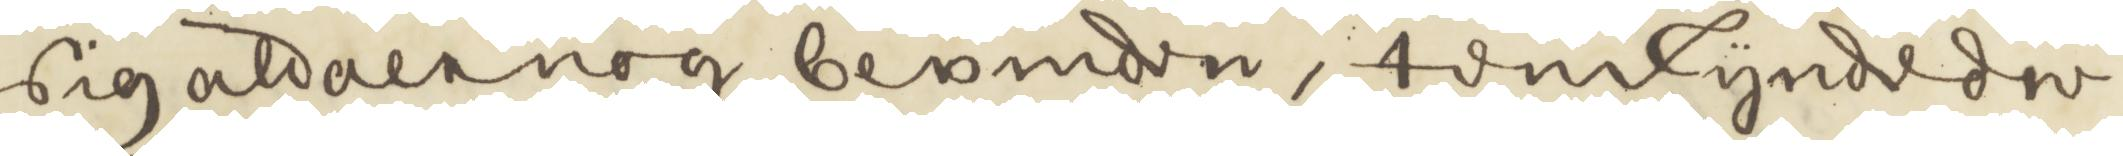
sig aldaer nog bevinden, ten Eijnde die
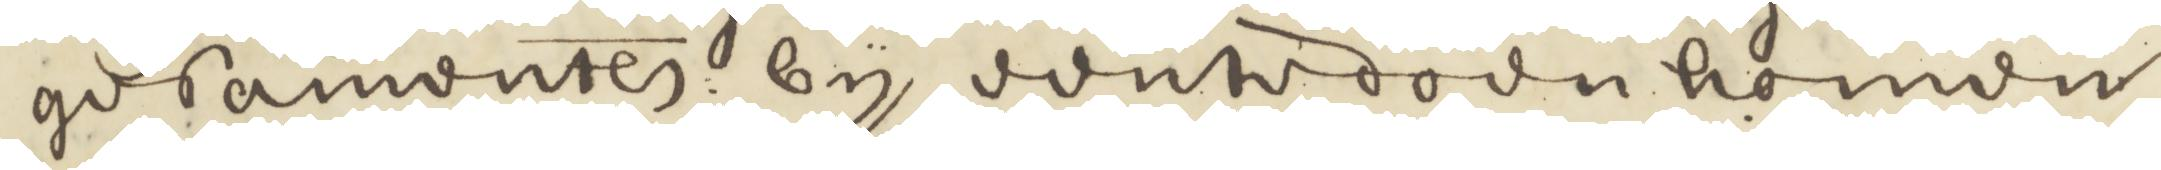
gesamentlijk bij een te doen komen
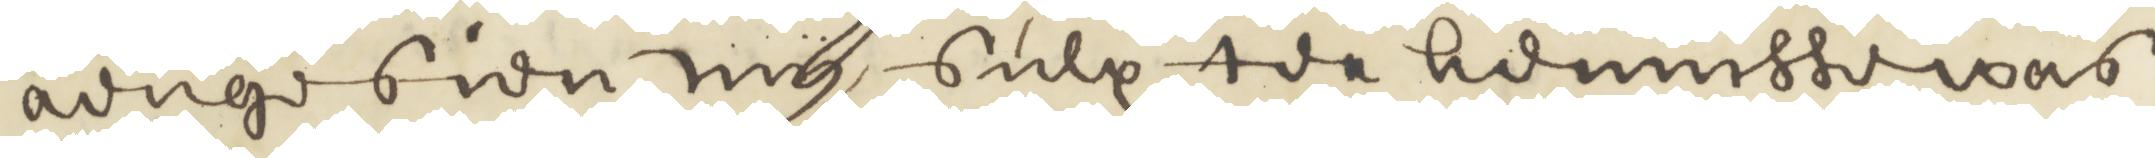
aengesien mij sulx ter kennisse was
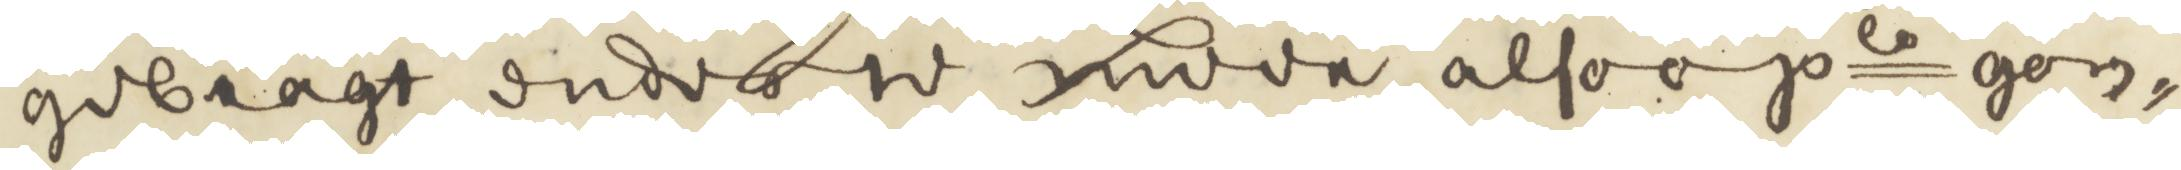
gebragt en des te meer alsoo p=lo gon„
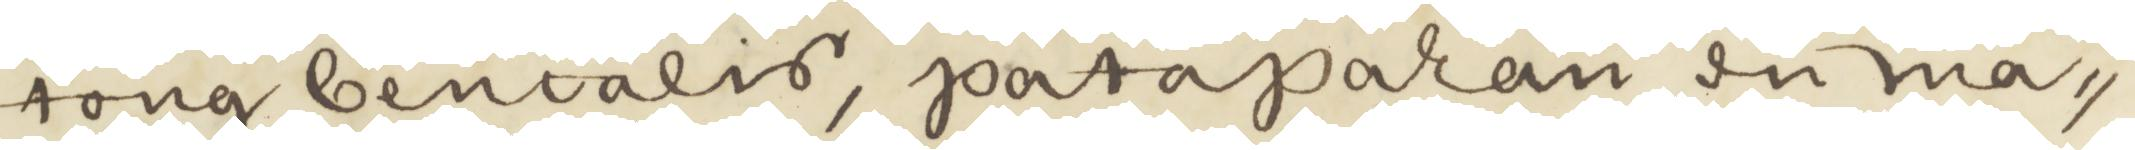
tong bencalis, patapahan en ma„
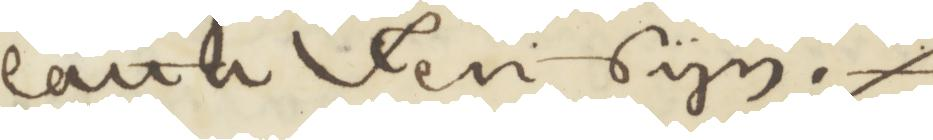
lacca Een sijn.
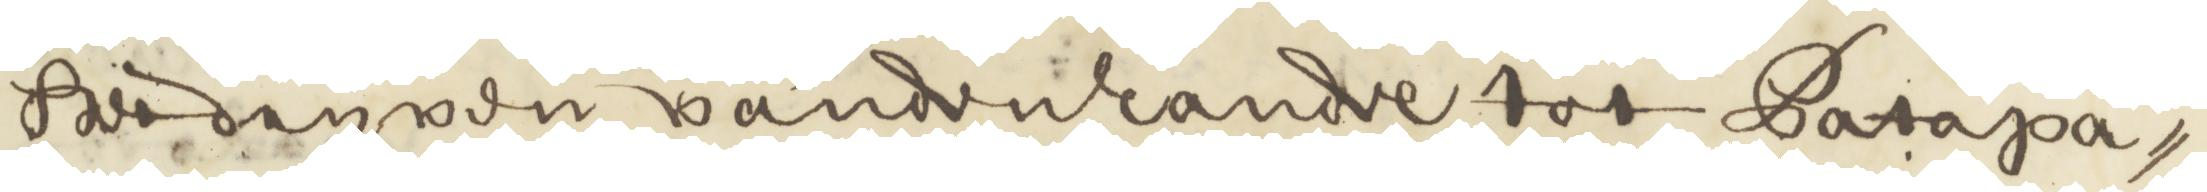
Het drijven van den handel tot Patapa„
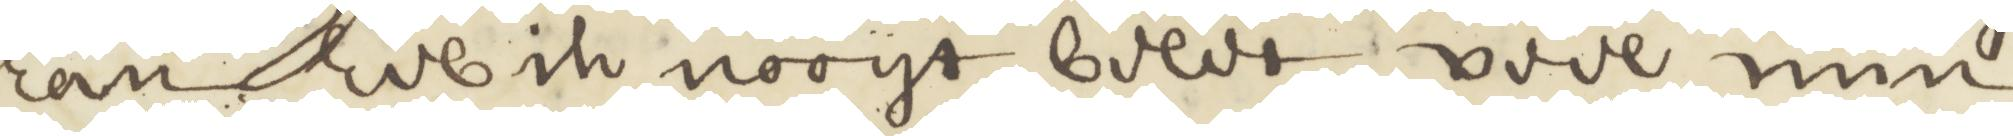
han heb ik nooijt belet, veel min
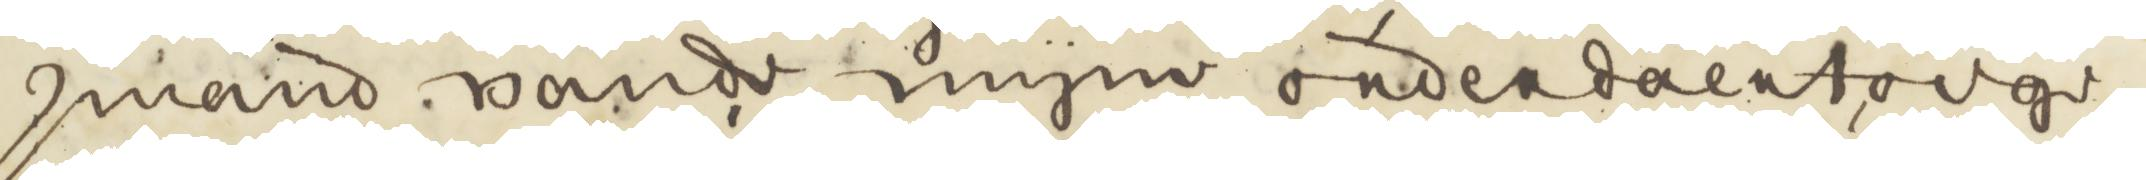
jmand vande mijne order daertoe ge„
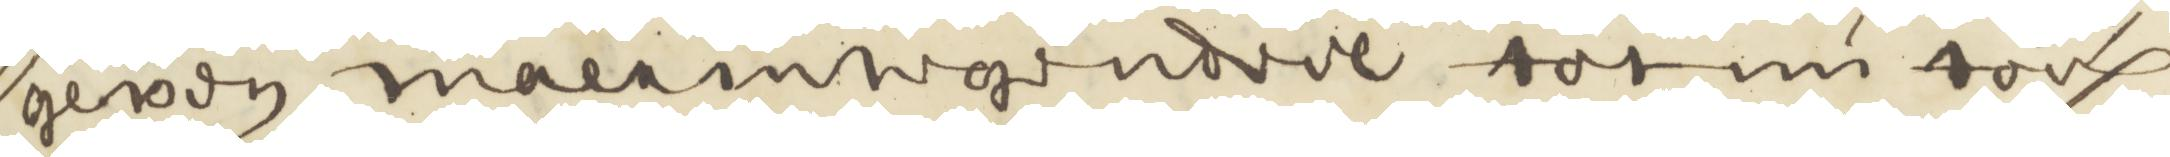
geven, maer in tegendeel tot nu toe
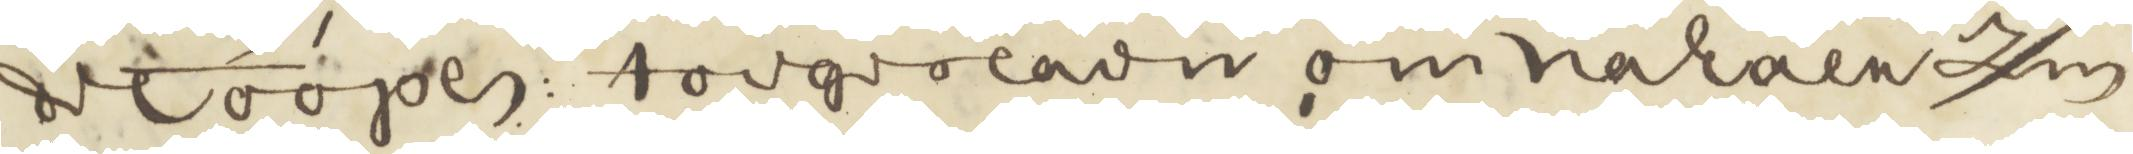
de Cooplijk toegestaen om na haer zin
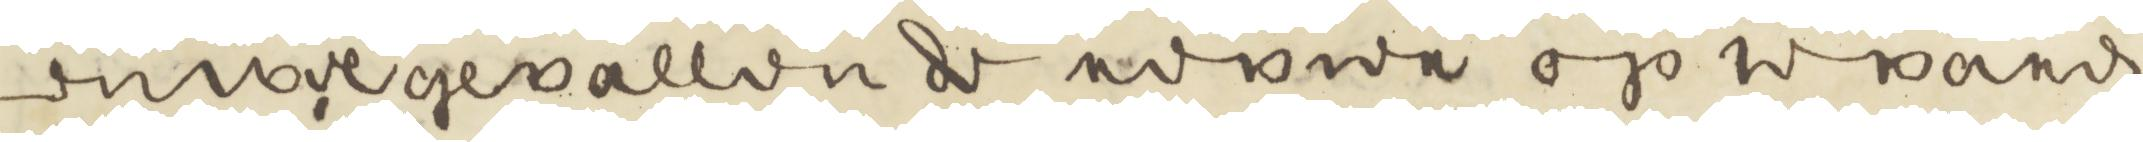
en wel gevallen de revier op te varen
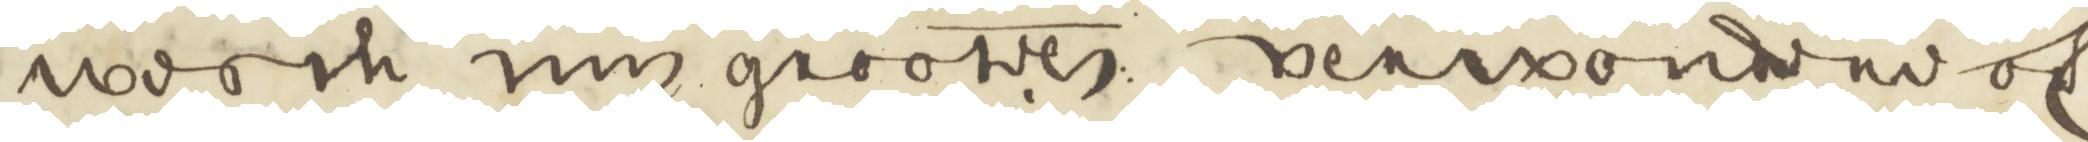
wes ik mij grootelijk verwonderde of
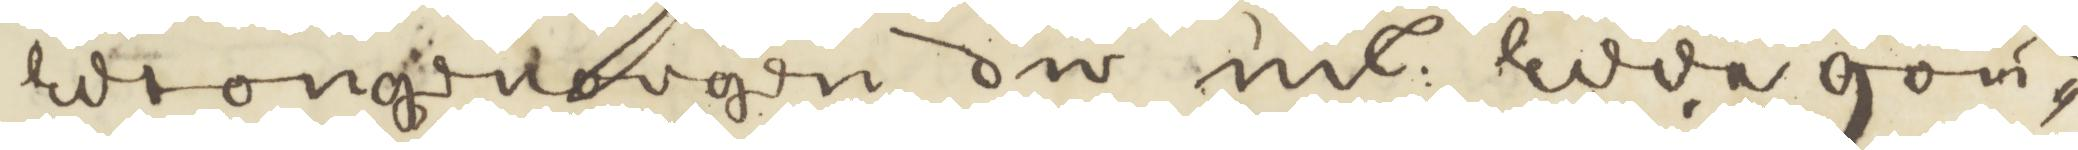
het ongenoegen die uE: heer gou„
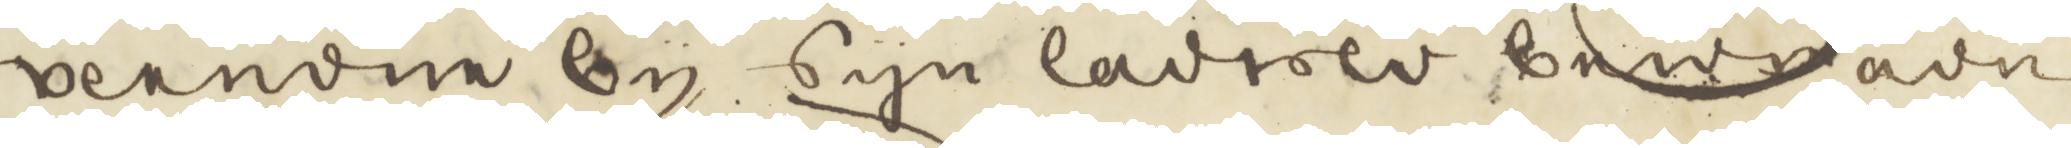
verneur bij sijn laetste briev aen
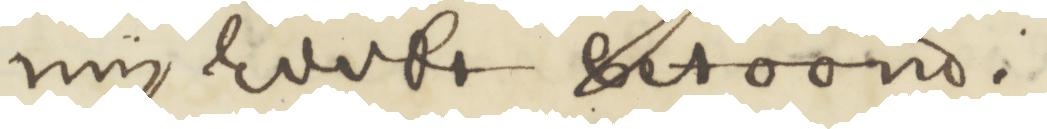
mij heeft betoond.
